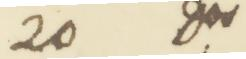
20 d:os
